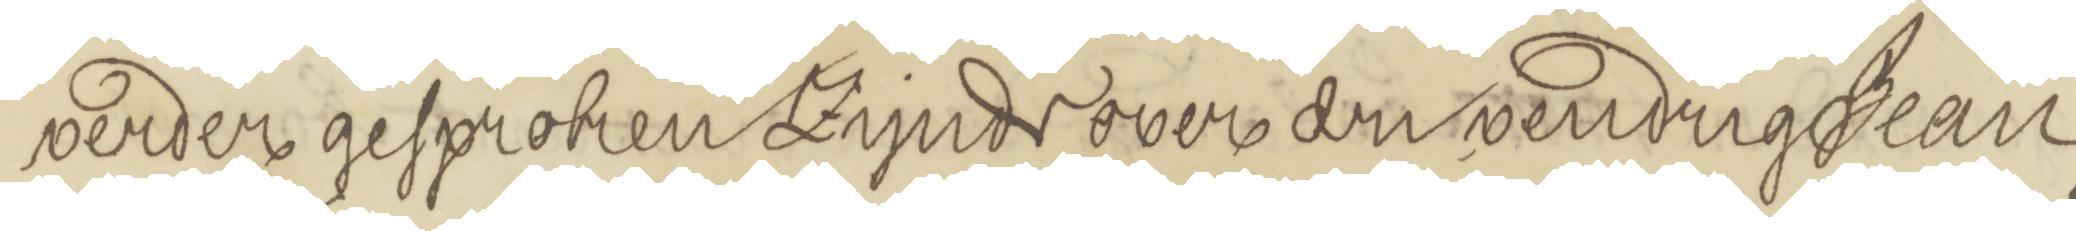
verder gesproken Zijnde over den vendrig Jean
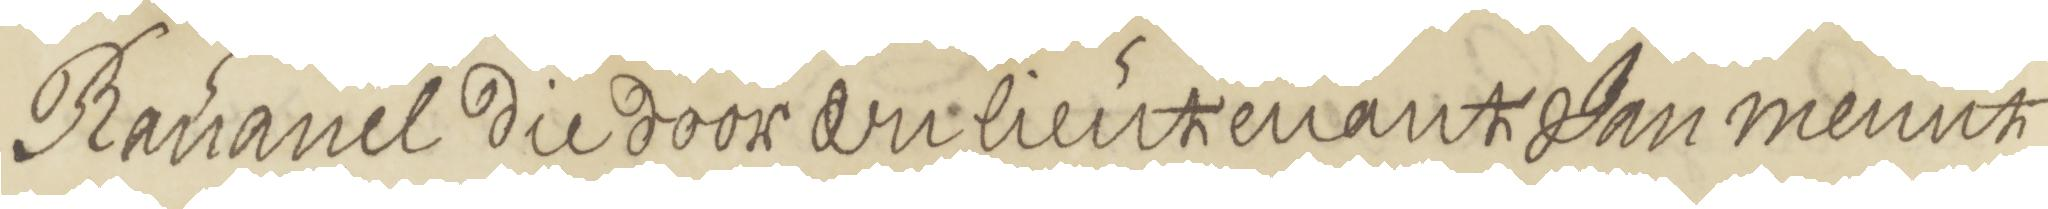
Rauanel die door den lieutenant Ian menut
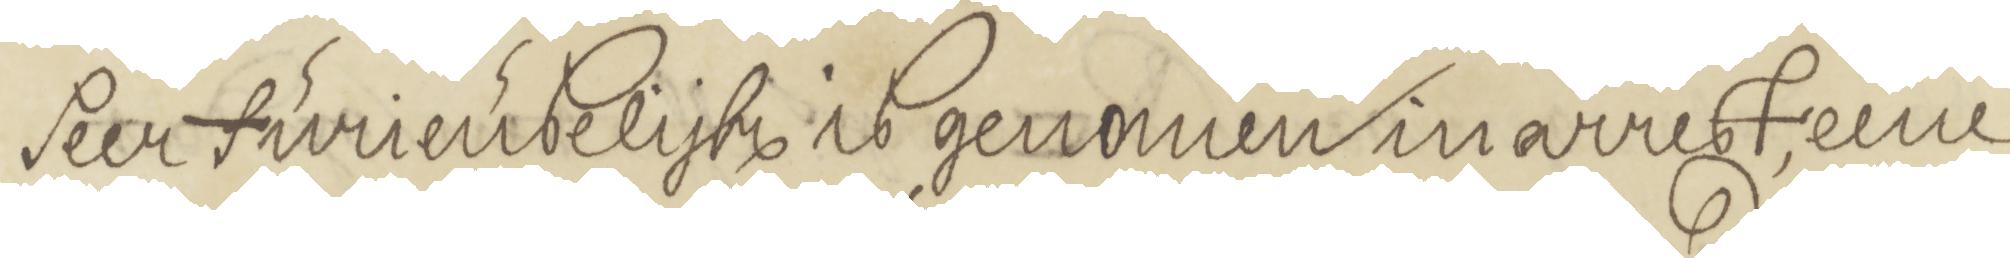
seer furieuselijk is genomen in arrest, eene
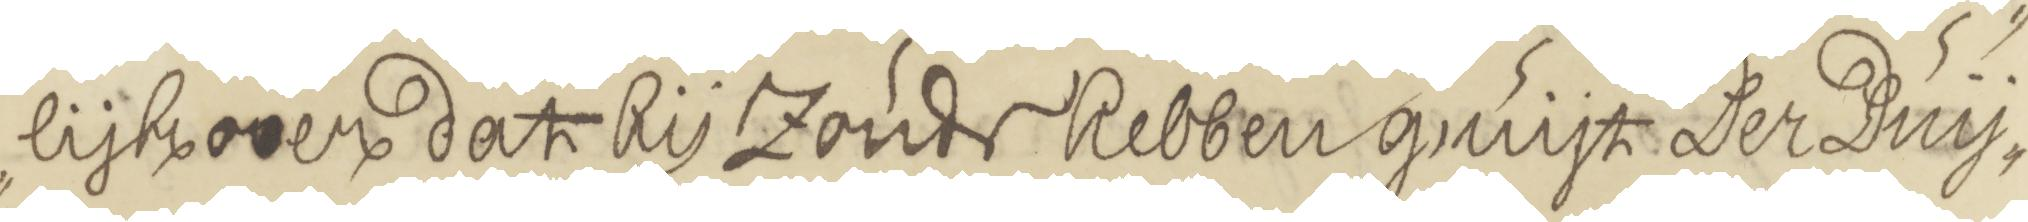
lijk over dat hij zoude hebben g'uijt Der Duij„
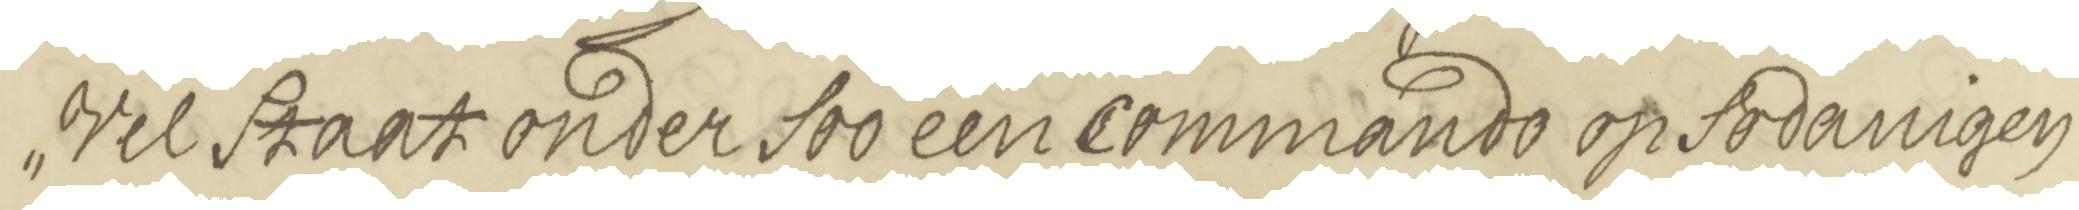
„vel staat onder soo een commando op sodanigen
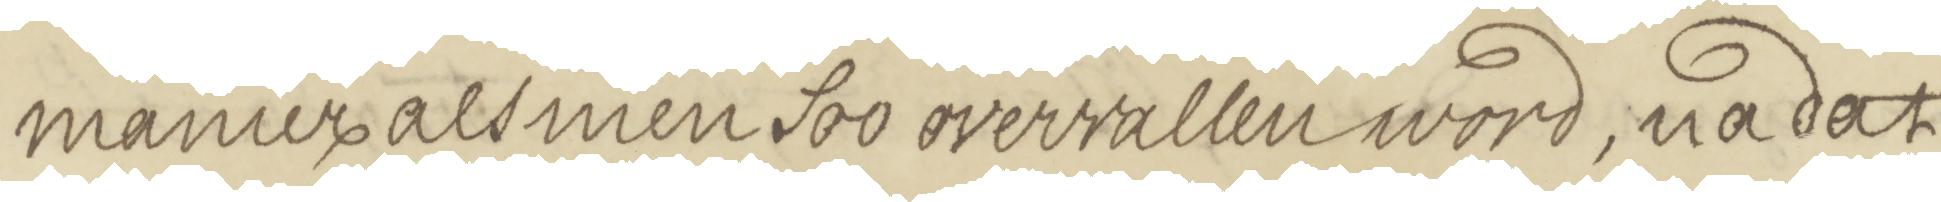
manier als men soo overvallen word, na dat
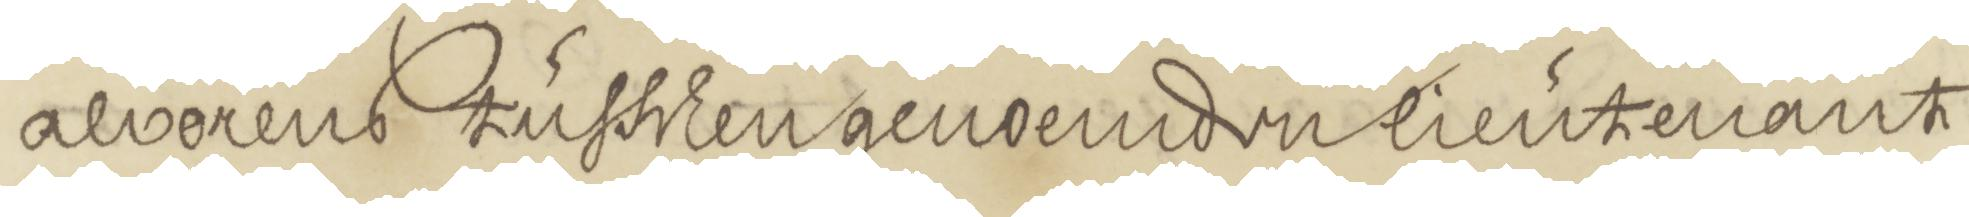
alvorens tusschen genoemden lieutenant
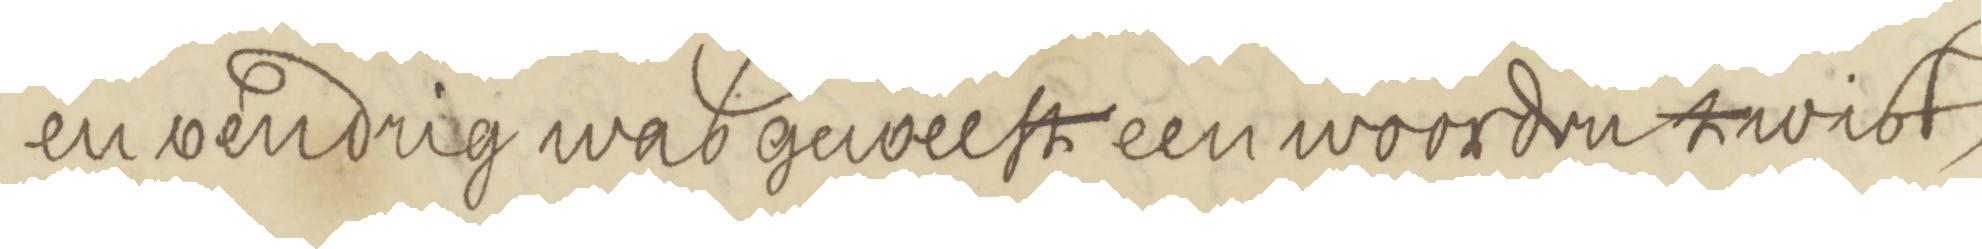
en vendrig was geweest een woorden twist
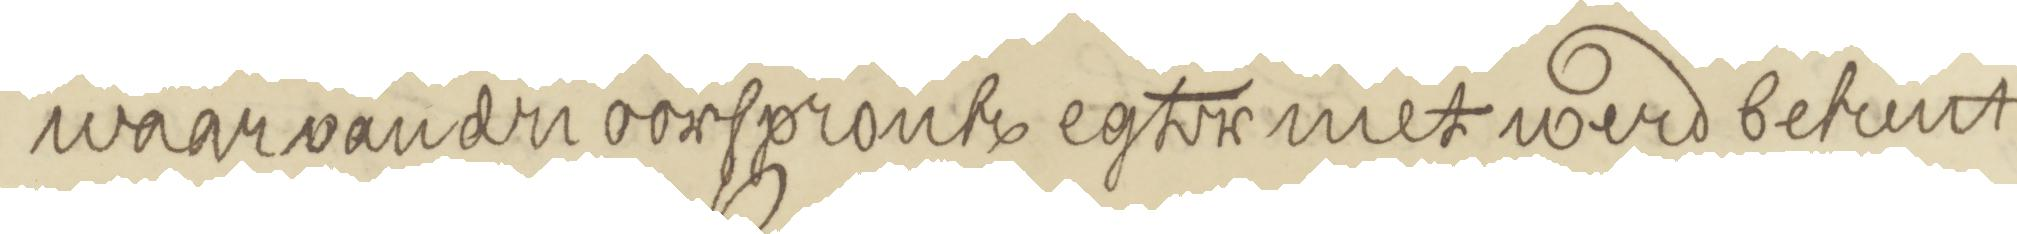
waar van den oorspronk egter niet werd bekent
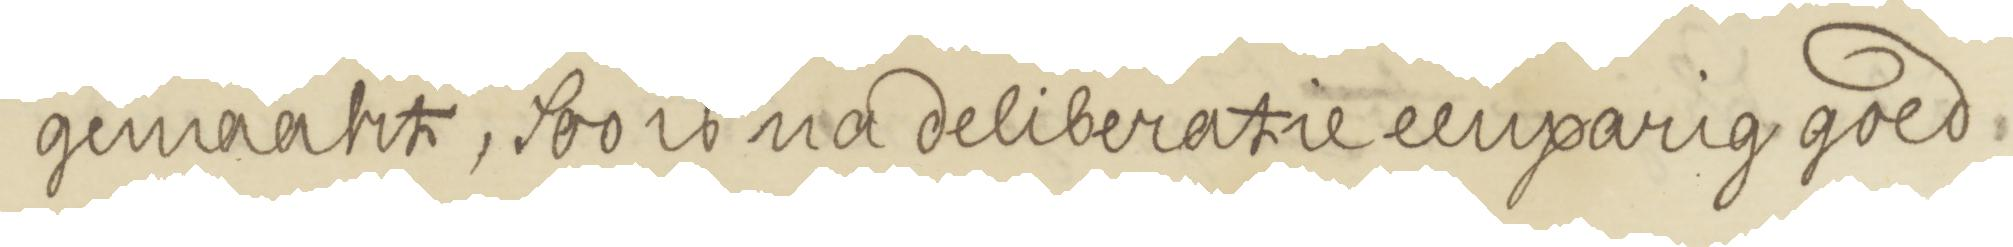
gemaakt, soo is na deliberatie eenparig goed
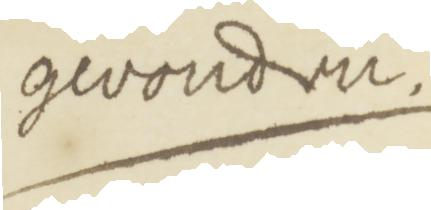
gevonden.
